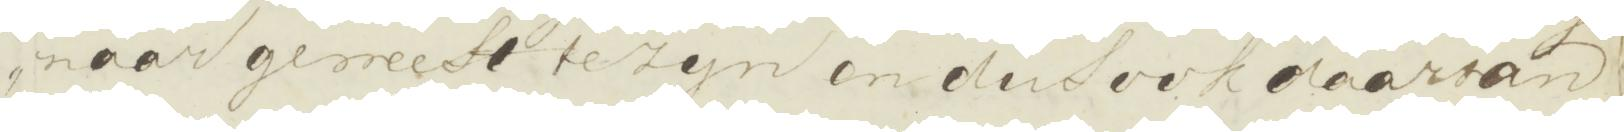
naar geweest te zyn en dus ook daarvan
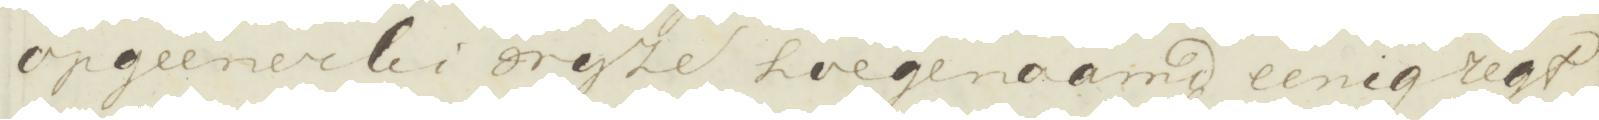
op geenerlei wyze hoegenaamd eenig regt
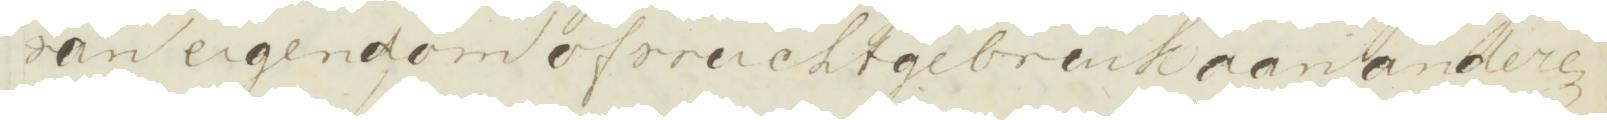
van eigendom of vruchtgebruik aan anderen
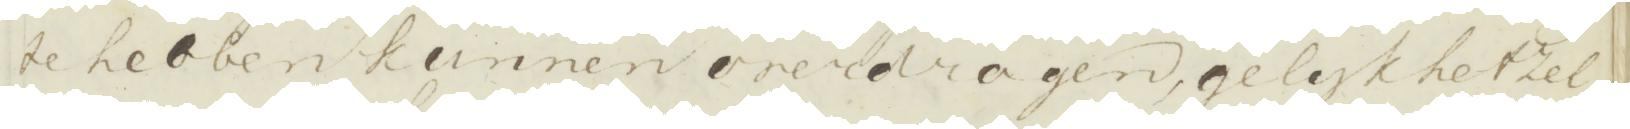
te hebben kunnen overdragen, gelyk hetzel
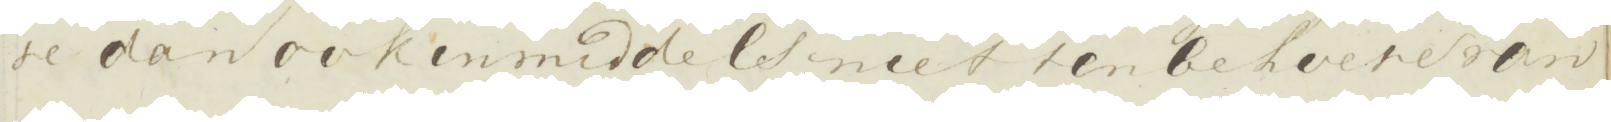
ve dan ook inmiddels niet ten behoeve van
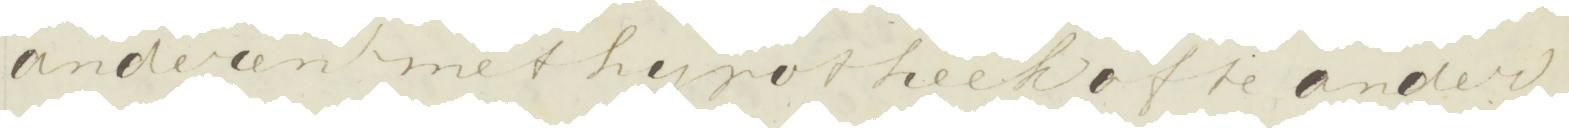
anderen met hypotheek of te ander
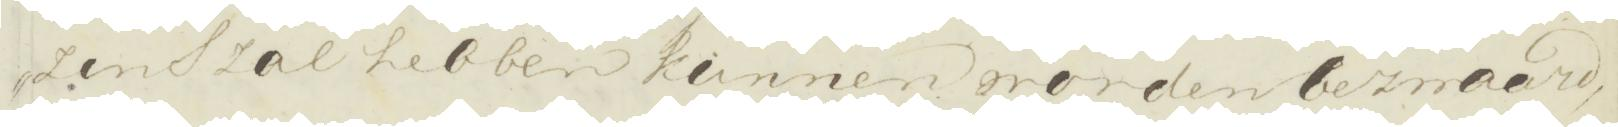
„zins zal hebben kunnen worden bezwaard,
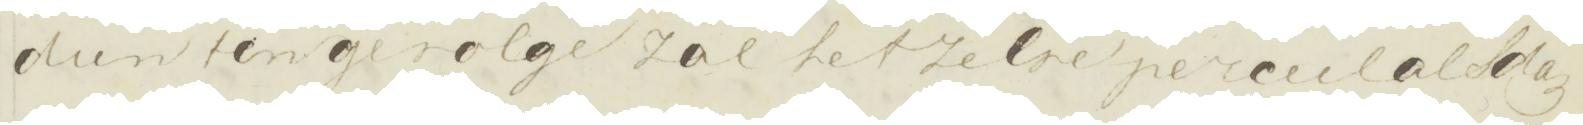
dien ten gevolge zal hetzelve perceel als dan
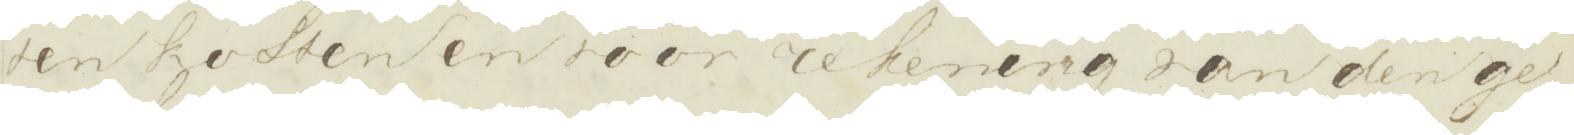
ten kosten en voor rekening van den ge
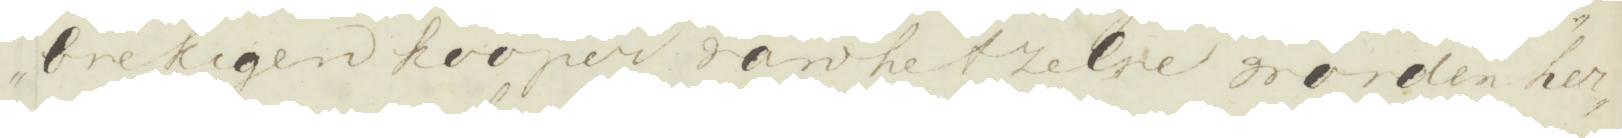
„brekigen kooper van hetzelve worden her„
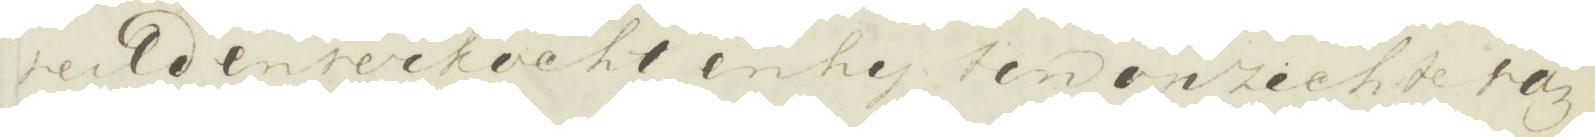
veild en verkocht en hy ten opzichte van
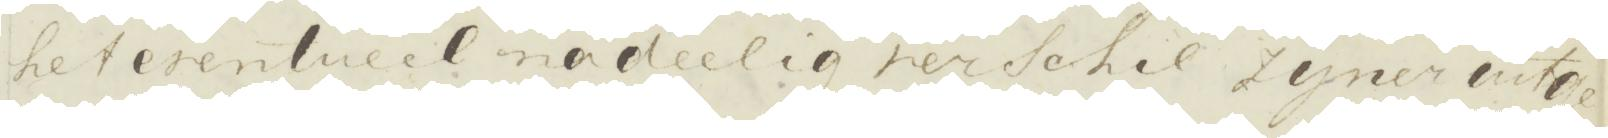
het eventueel nadeelig verschil zyner uitge
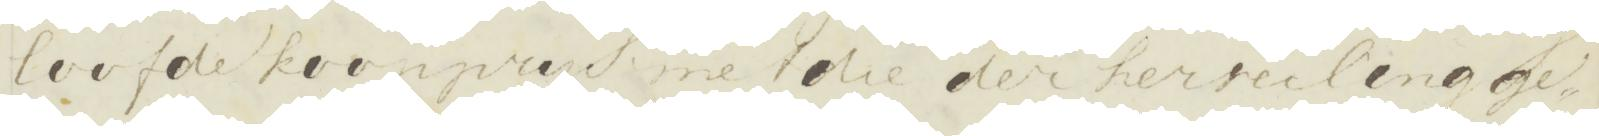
loofde koopprys met die der herveiling ge„
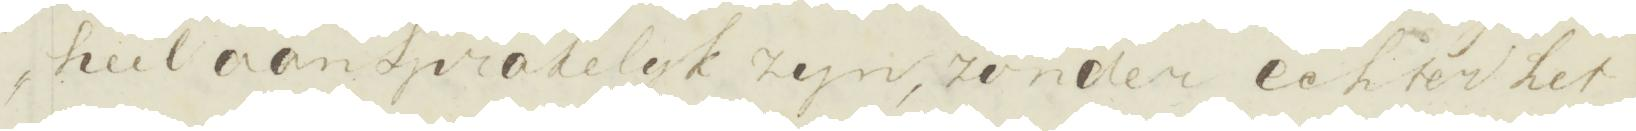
„heel aan sprakelyk zyn, zonder echter het
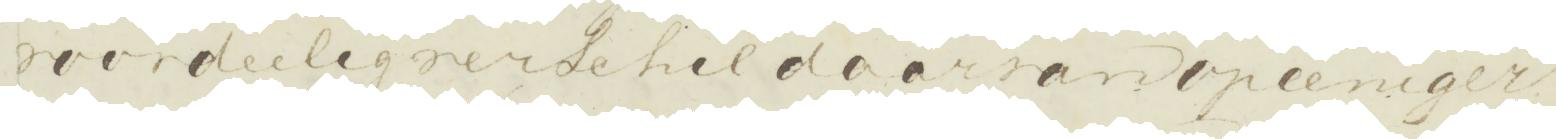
voordeelig verschil daarvan op eeniger
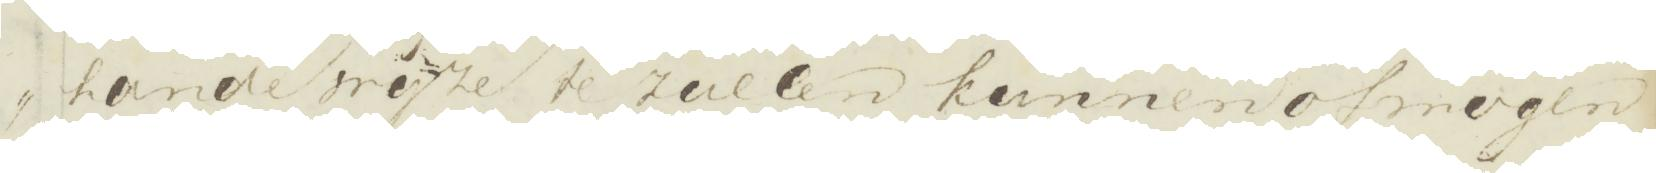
„hande wyze te zullen kunnen of mogen
